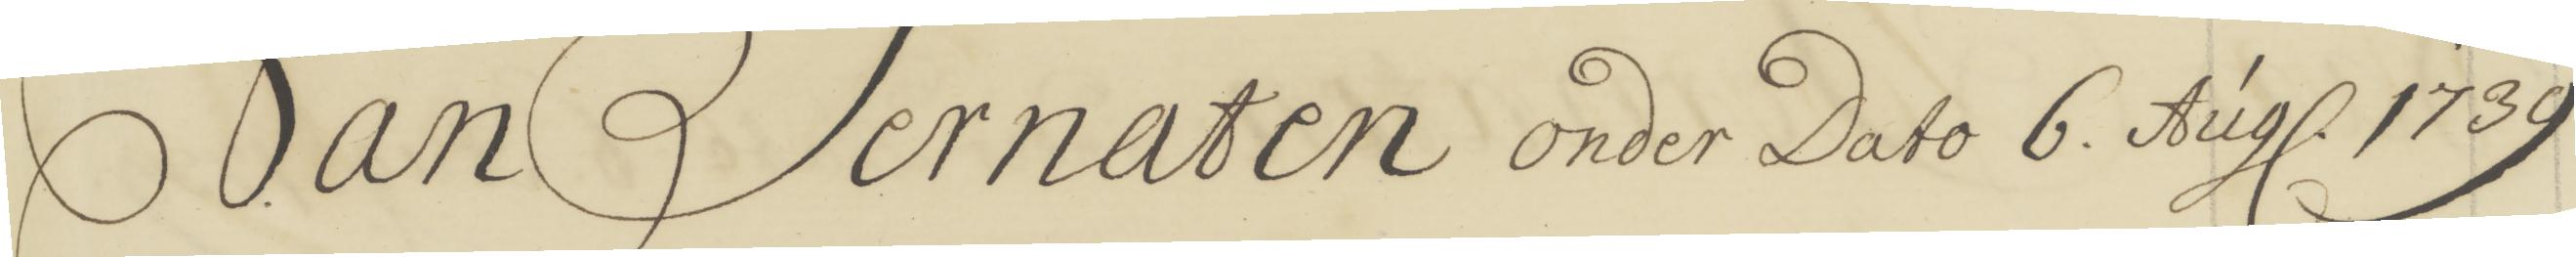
Van Ternaten onder Dato 6. AugC. 1739
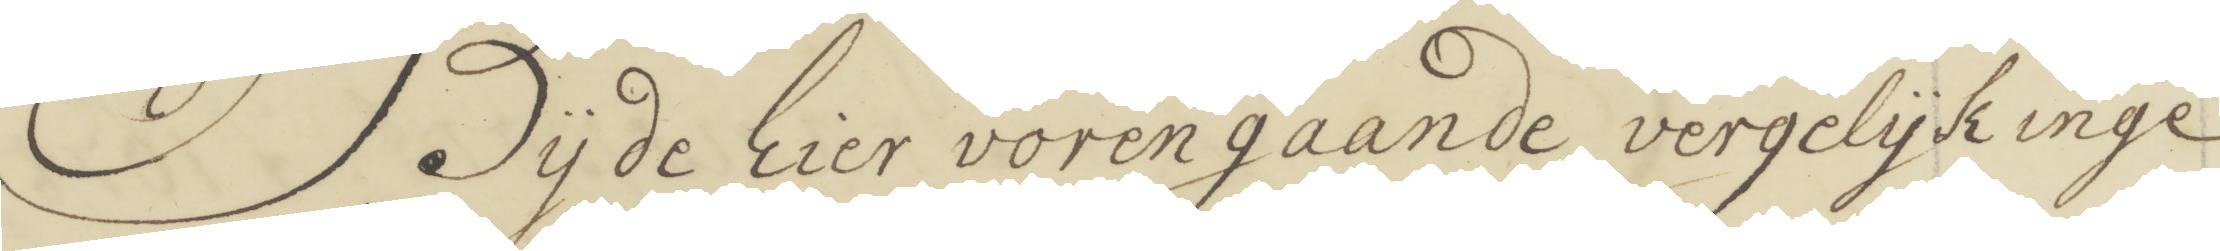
Bij de hier vorengaande vergelijkinge
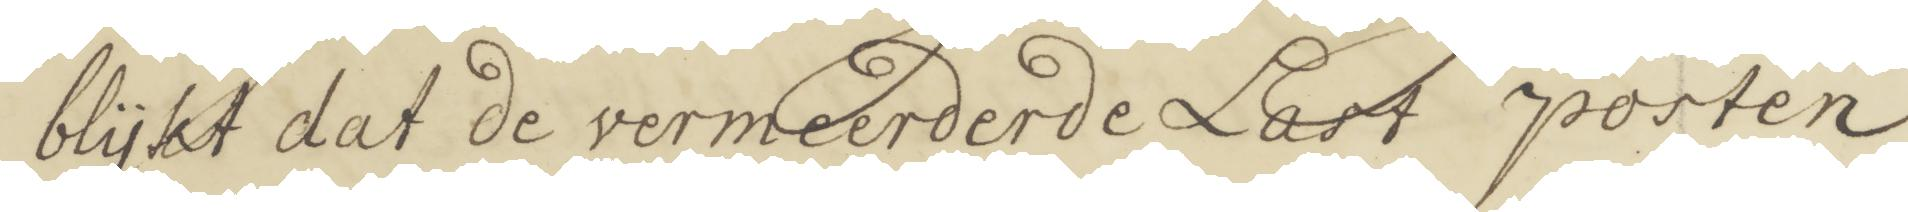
blijkt dat de vermeerderde Last posten
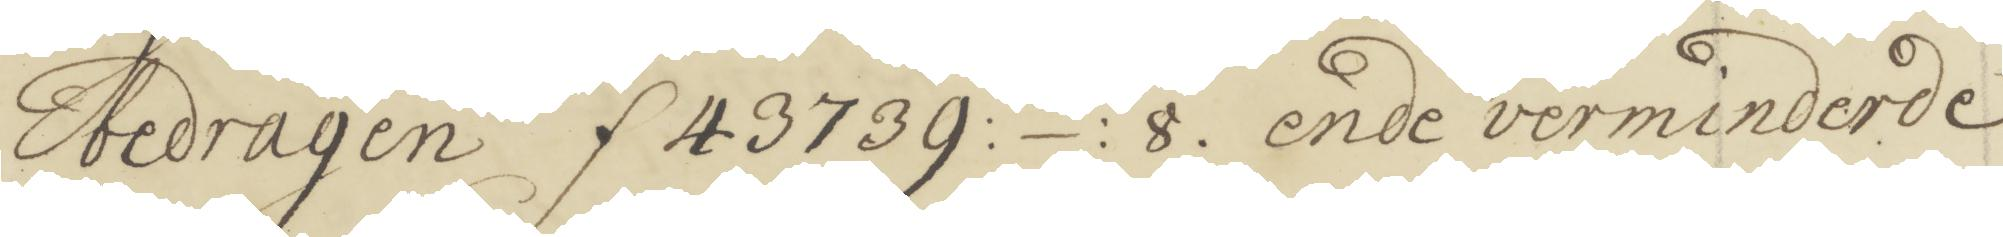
bedragen ƒ 43739: — : 8. ende verminderde
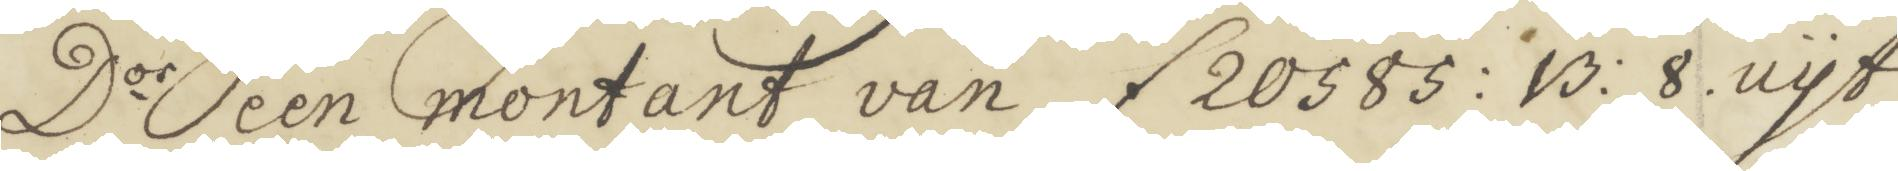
D=os een montant van ƒ20585: 13: 8. uijt
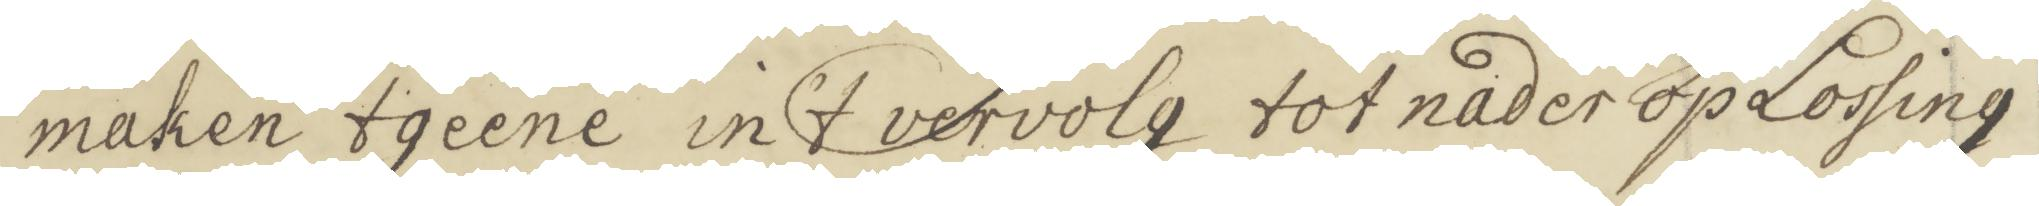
maken 't geene in ’t vervolg tot nader op Lossing
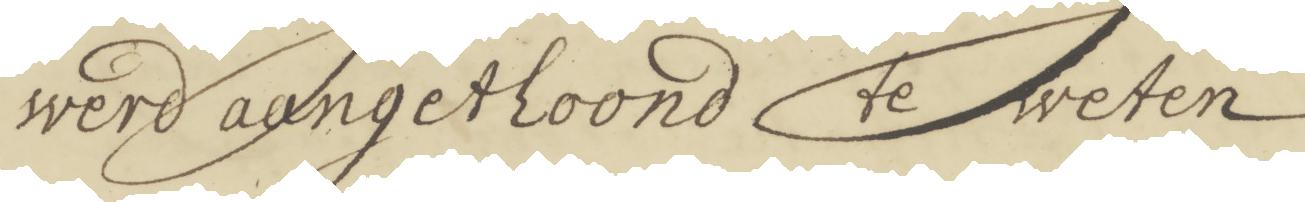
werd aangethoond te weten
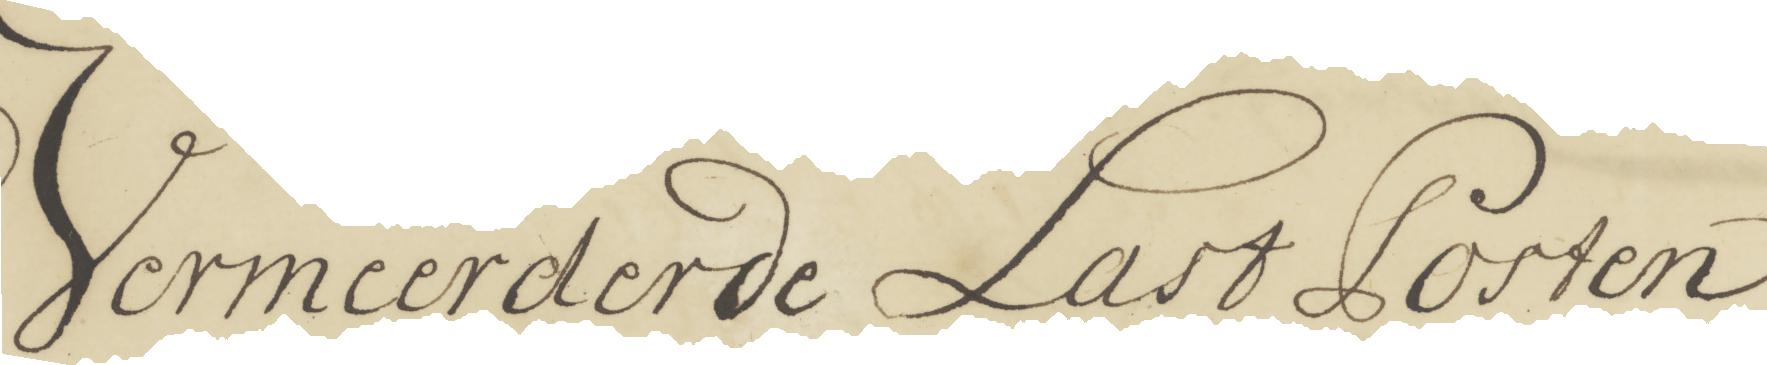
Vermeerderde Last Posten
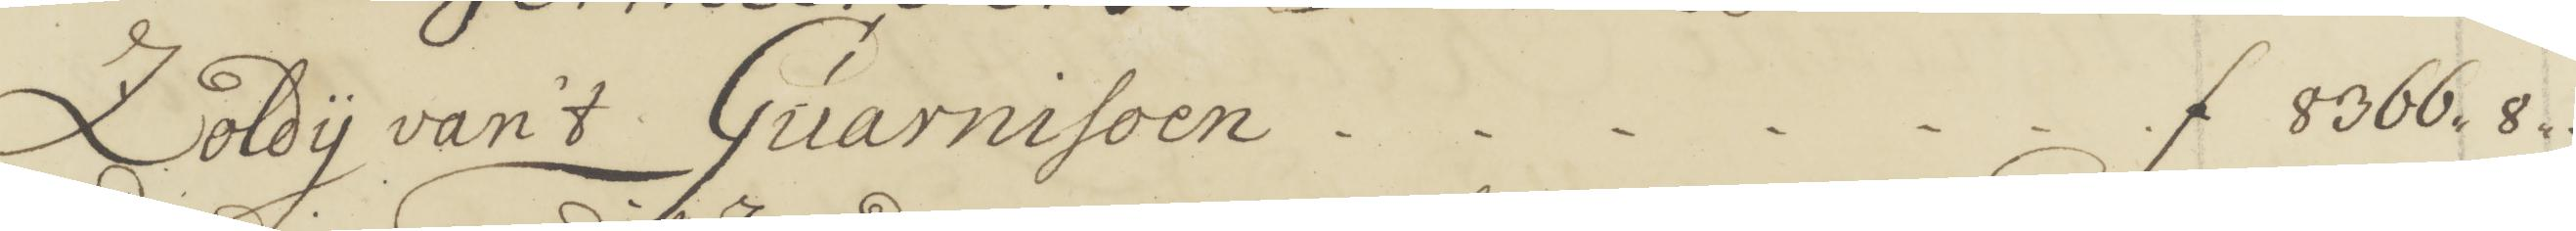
Zoldij van ’t Guarnisoen - - - - - - . ƒ 8366„ 8„
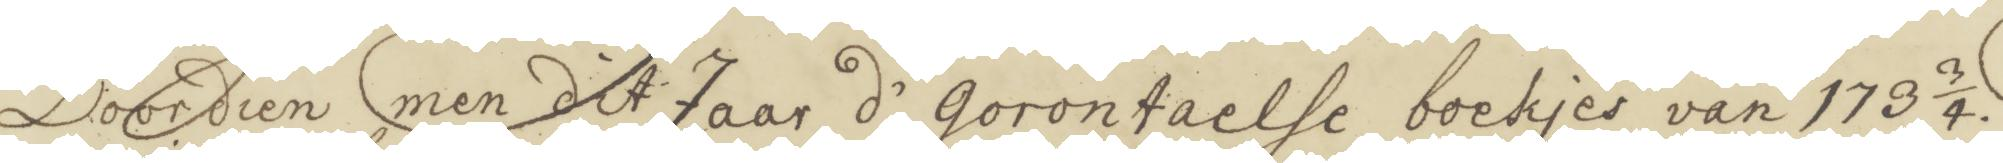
Door dien men dit Jaar d’ Gorontaelse boekjes van 173¾.
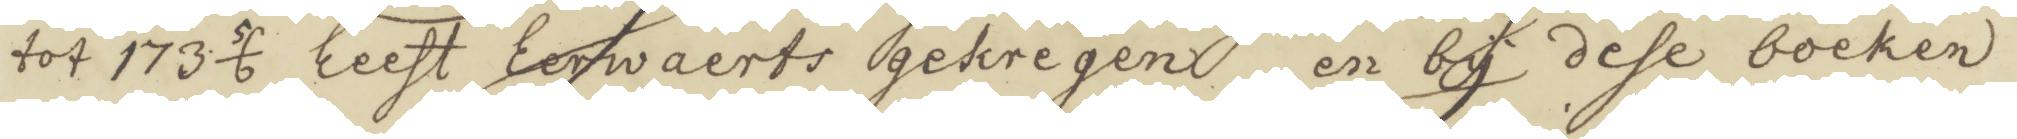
tot 1735/6 heeft herwaerts gekregen, en bij dese boeken
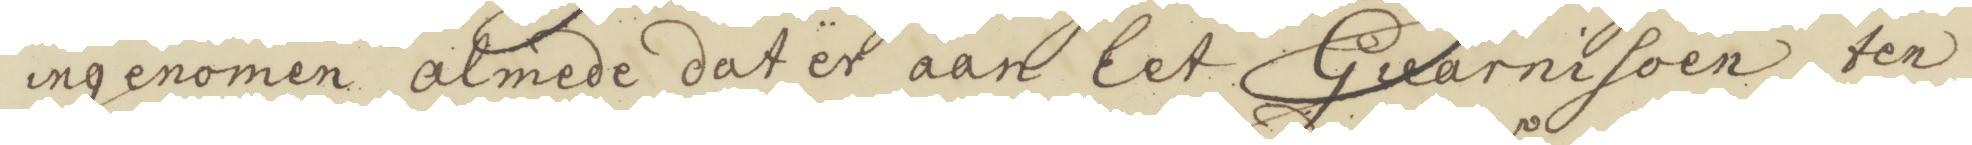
ingenomen almede dat "er aan het Guarnisoen ten
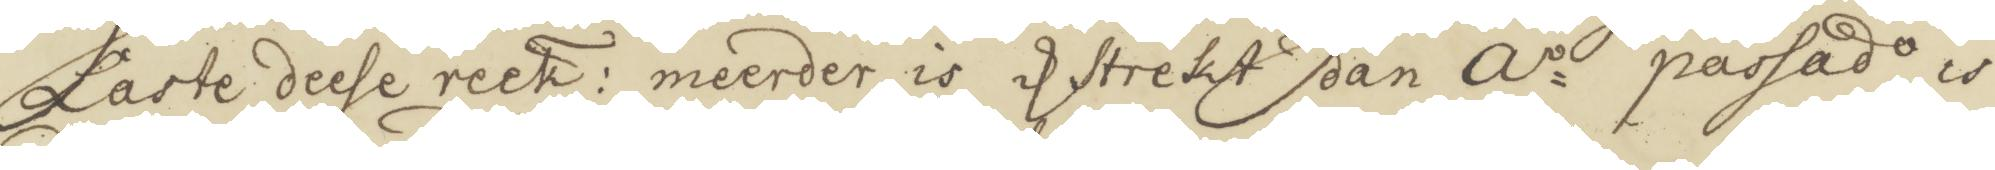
Laste deese reek: meerder is verstrekt dan a=o passado is
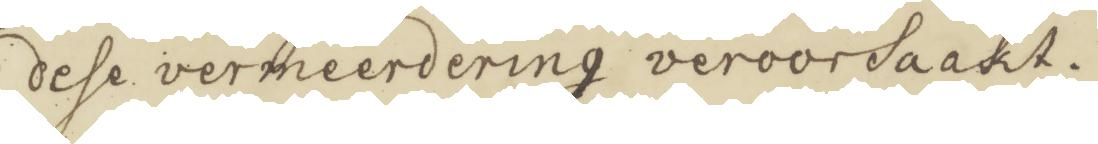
dese vermeerdering veroorsaakt.
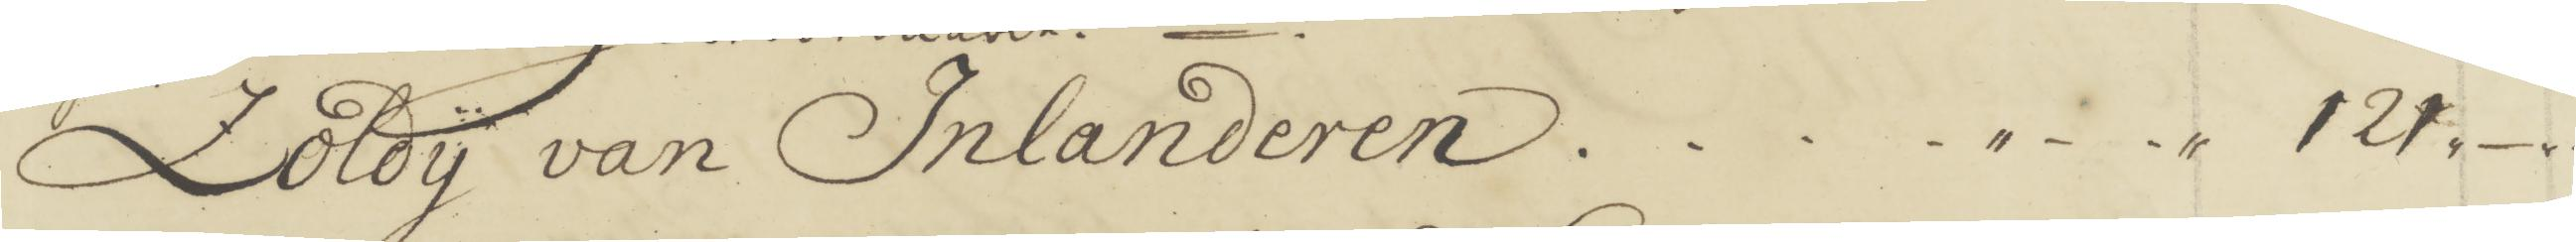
Zoldij van Inlanderen . . . - „ - - „ 121„—„
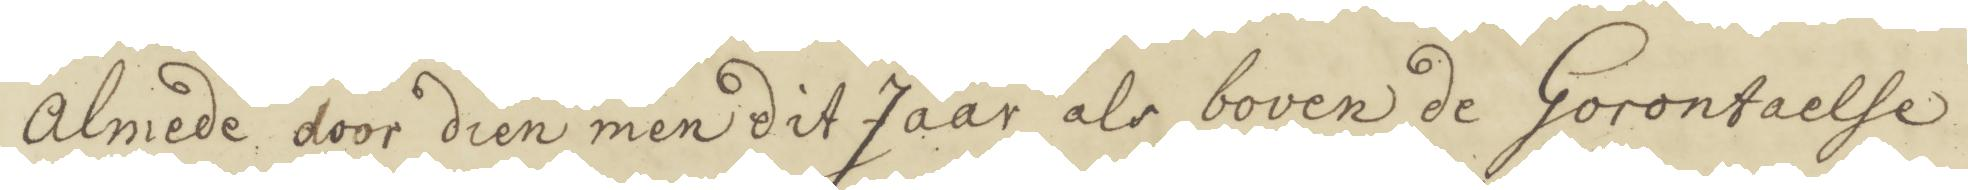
almede door dien men dit Jaar als boven de Gorontaelse
